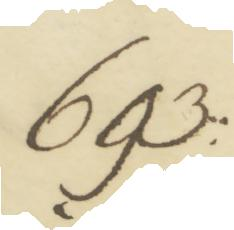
693:
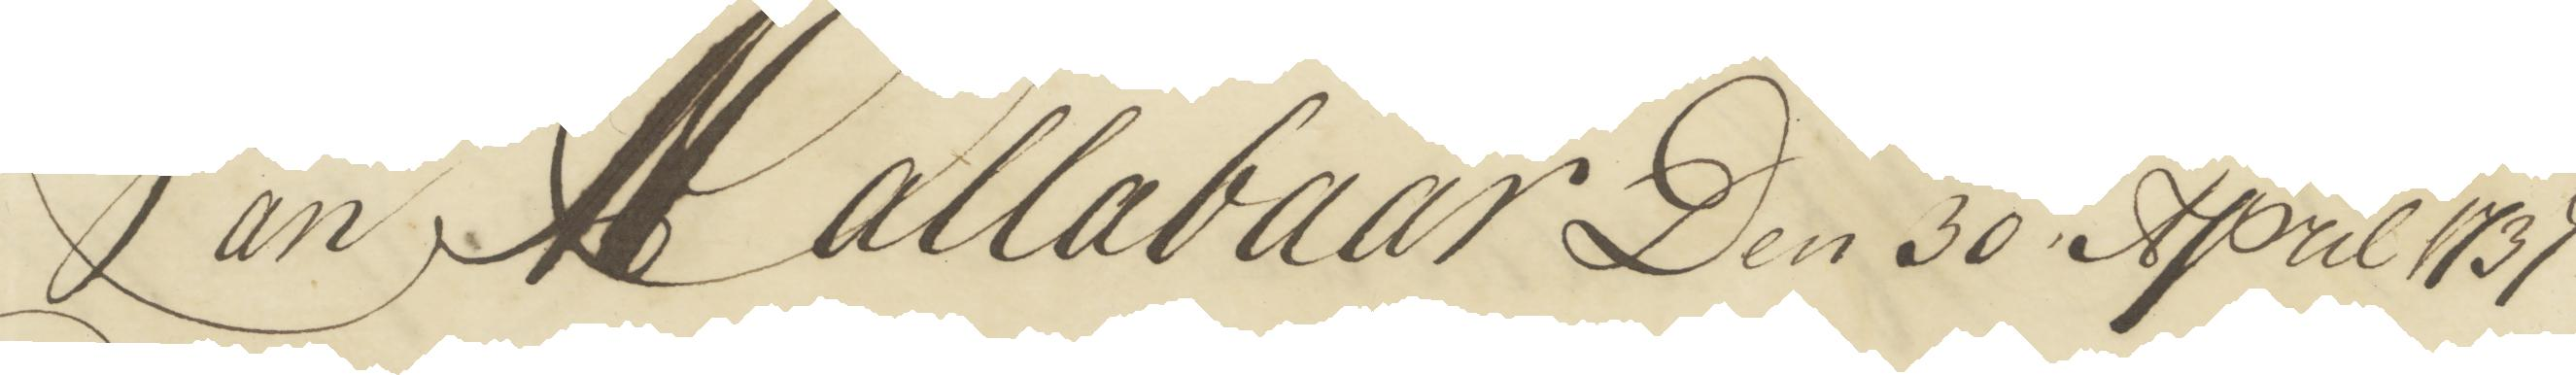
Van Mallabaar Den 30:' April 1737
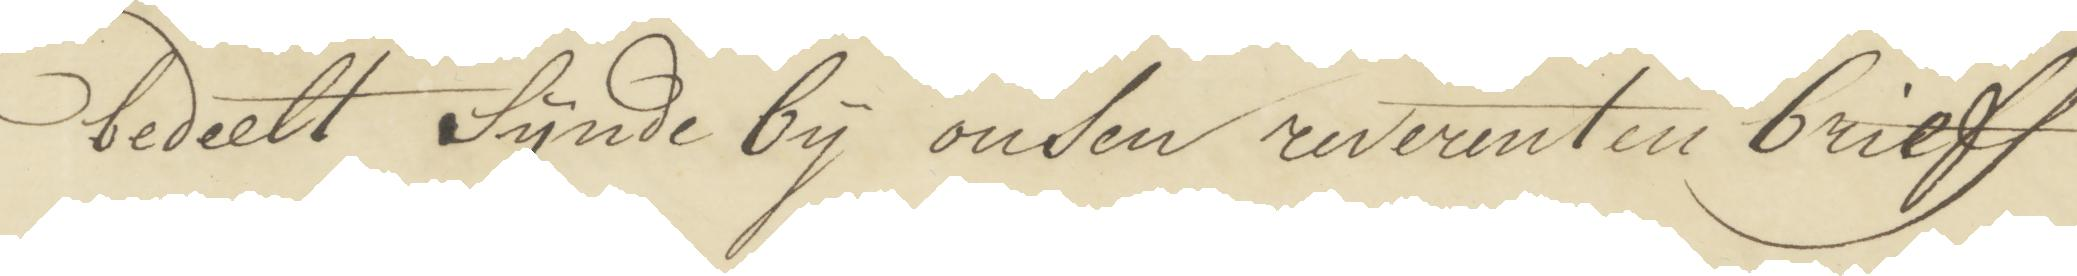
bedeelt sijnde bij onsen reverenten brieff
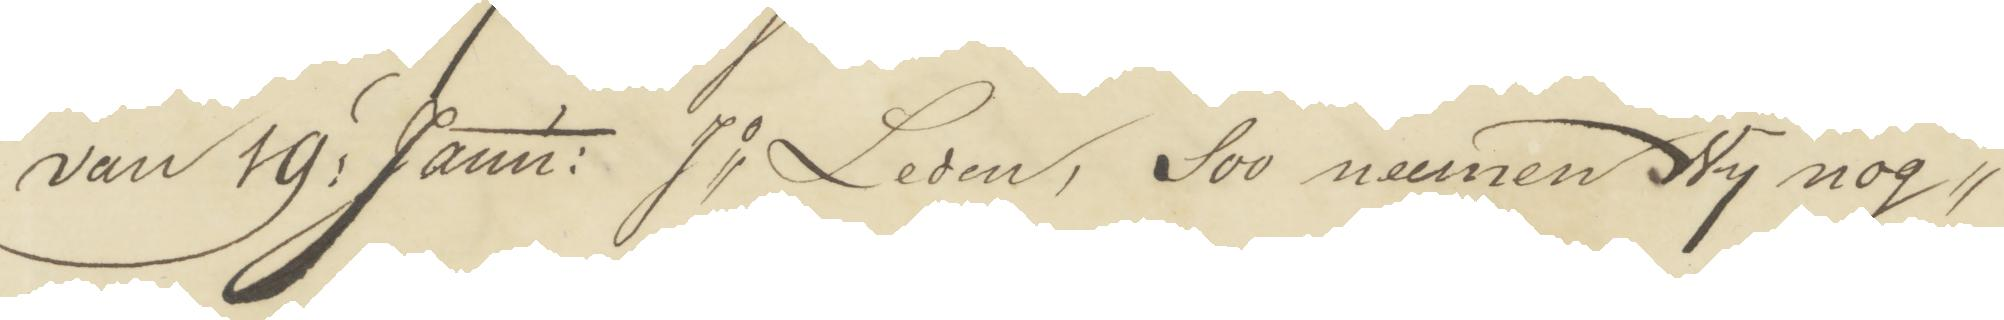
van 19:' Janu: J„o Leden, soo neemen wij nog„
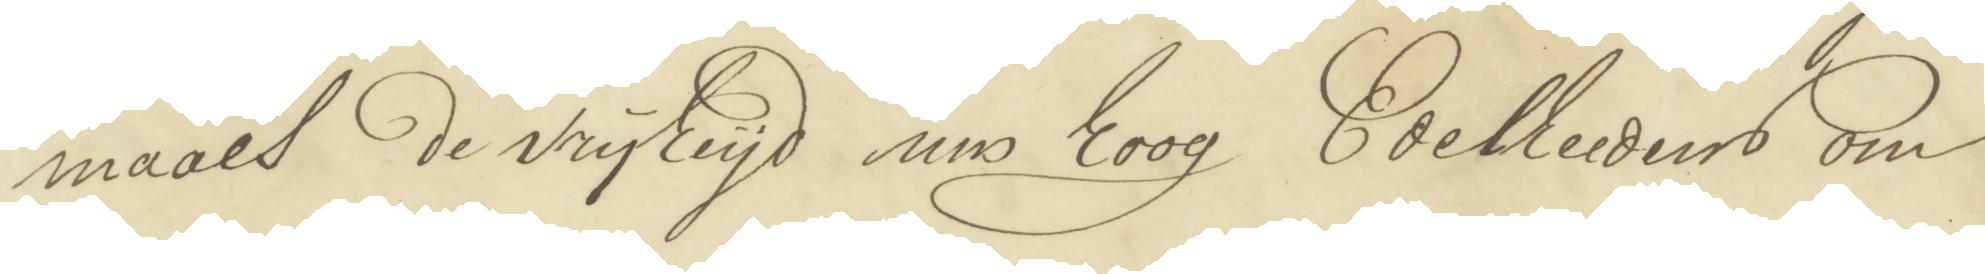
maals de vrijheijd uw hoog Edelheedens om
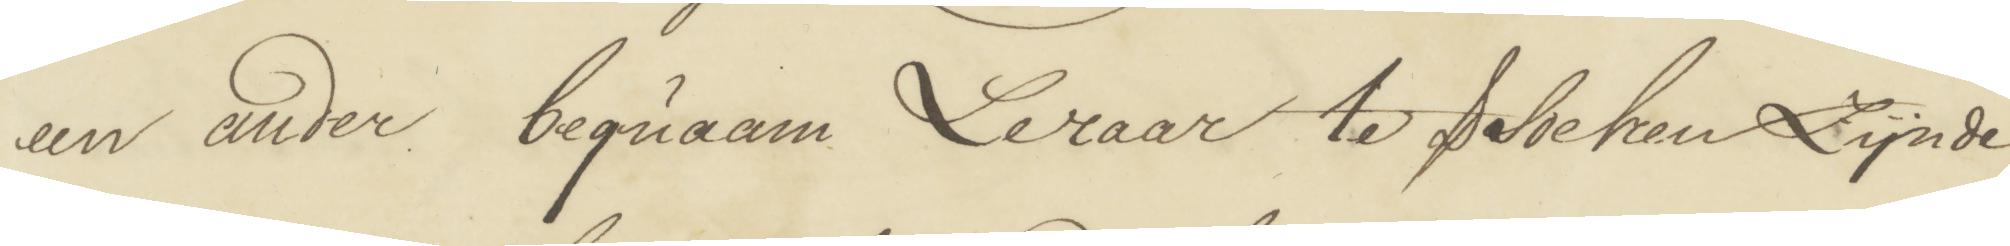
een ander bequaam Leraar te versoeken zijnde
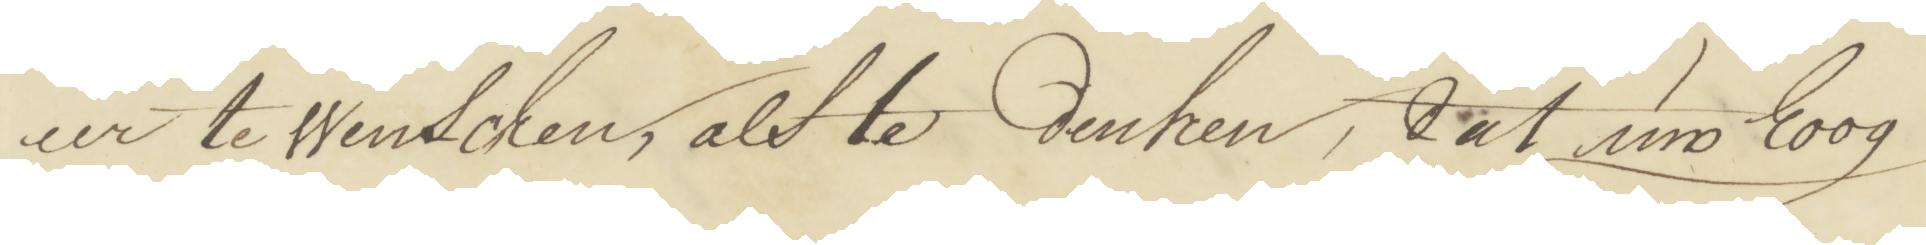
eer te wenschen, als te denken, dat uw hoog
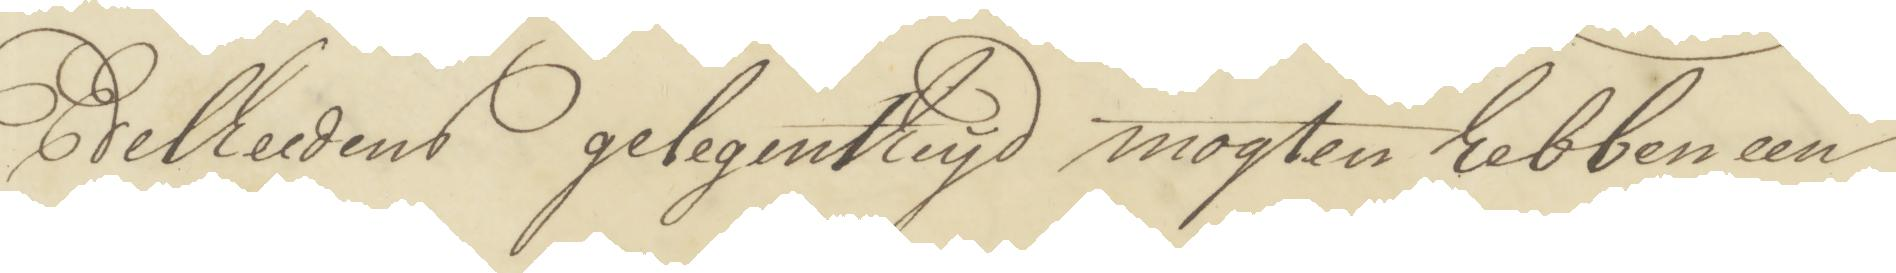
Edelheedens gelegentheijd mogten hebben een
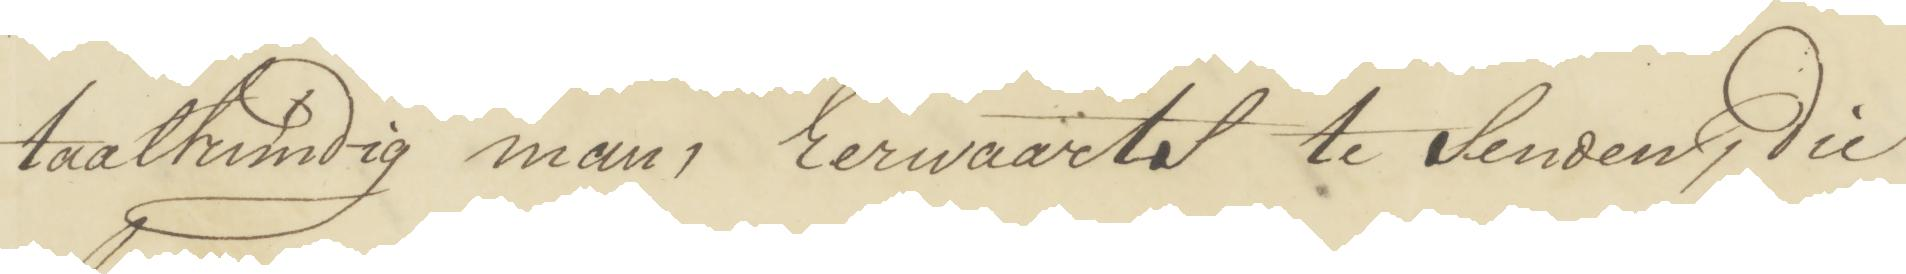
taalkundig man, herwaarts te senden, die
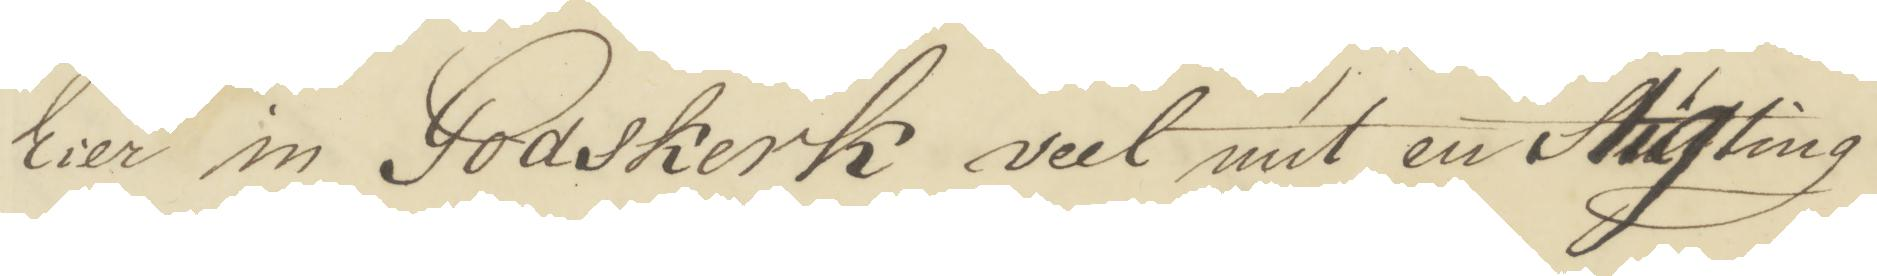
hier in Godskerk veel nut en stigting
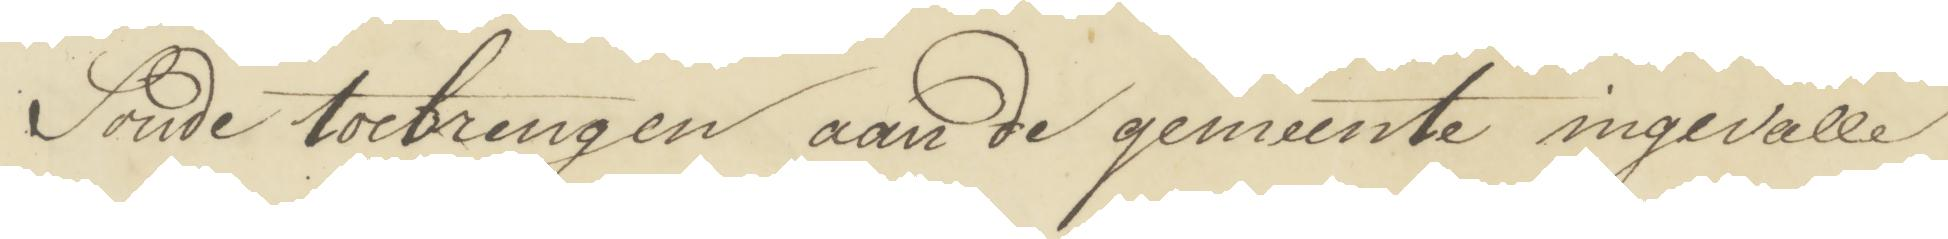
soude toebrengen aan de gemeente ingevalle
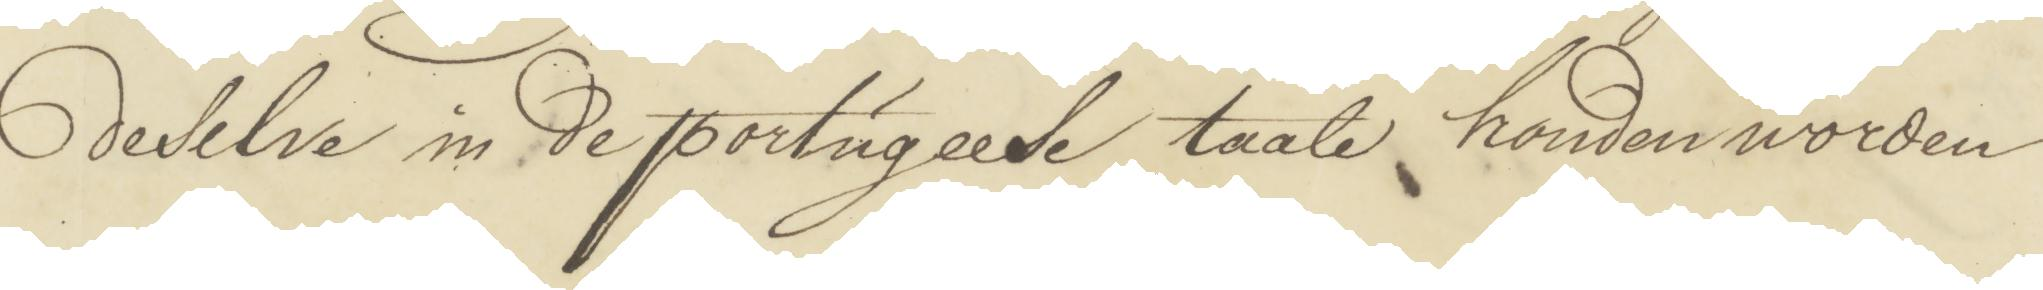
deselve in de portugeese taale konden worden
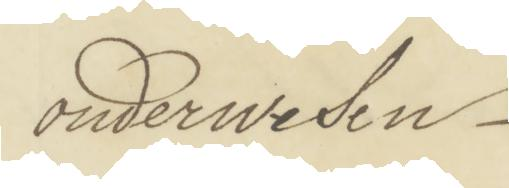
onderwesen
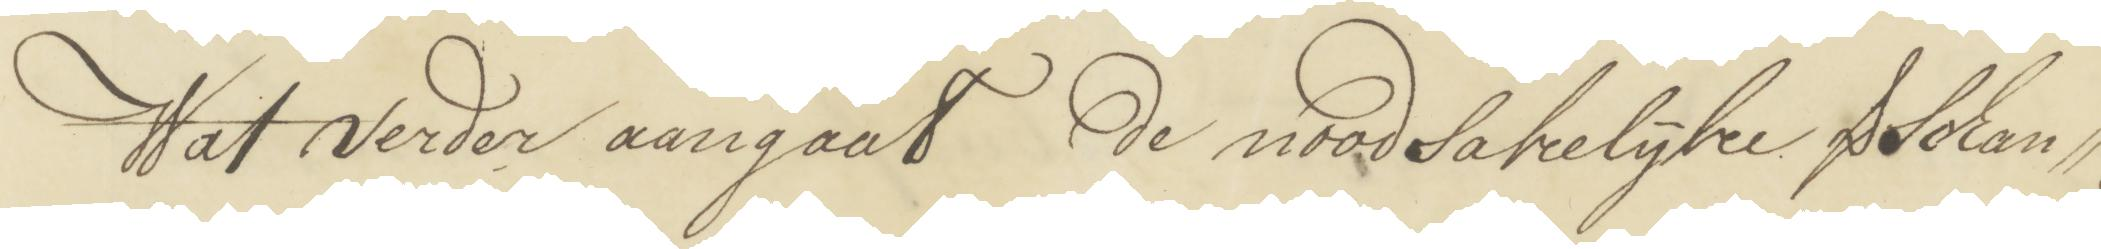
Wat verder aangaat de noodsakelijke verschan„
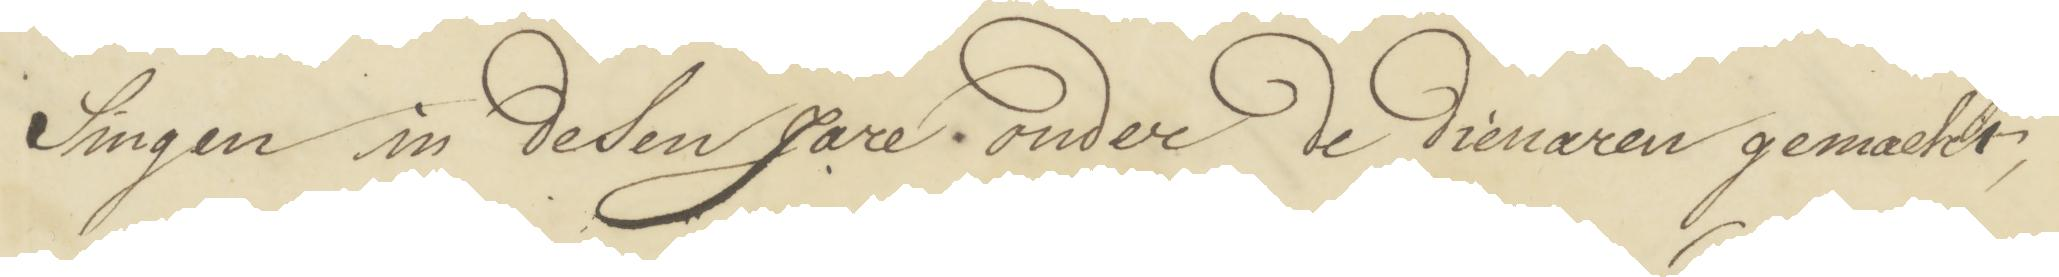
singen in desen Jare onder de dienaren gemaekt,
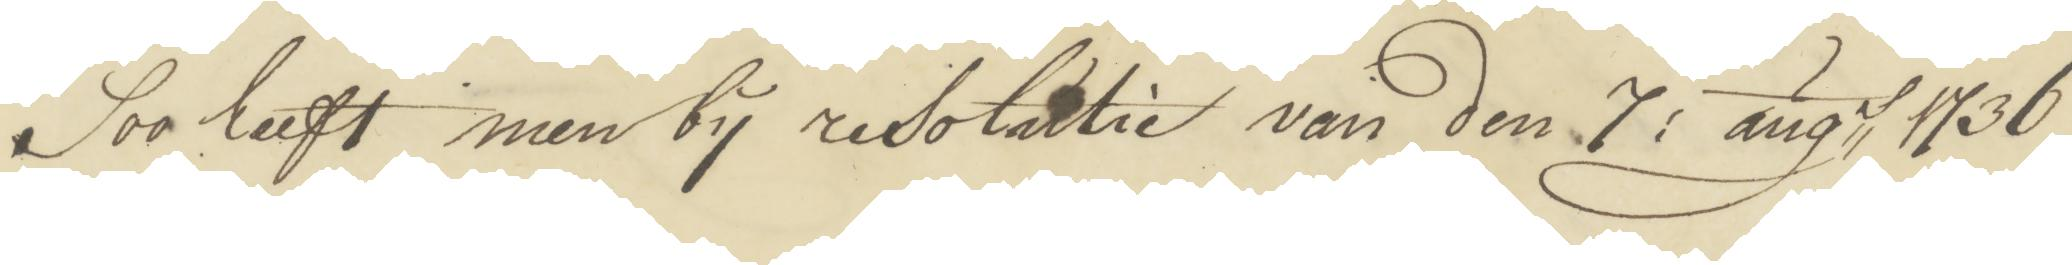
soo heeft men bij resolutie van den 7:' aug„s 1736
